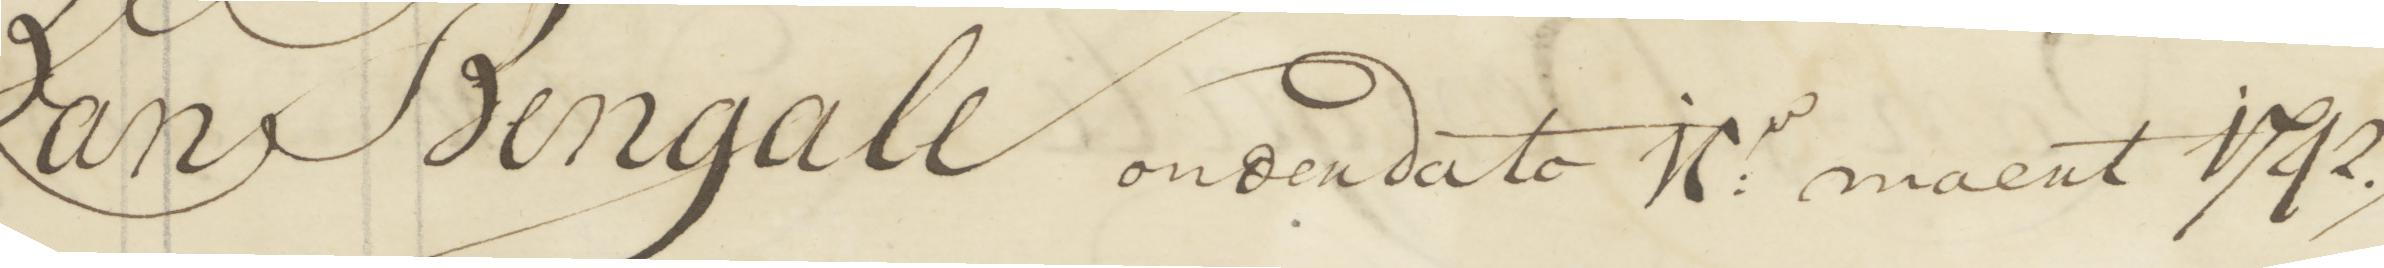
Van Bengale onder dato 15:' maert 1742.
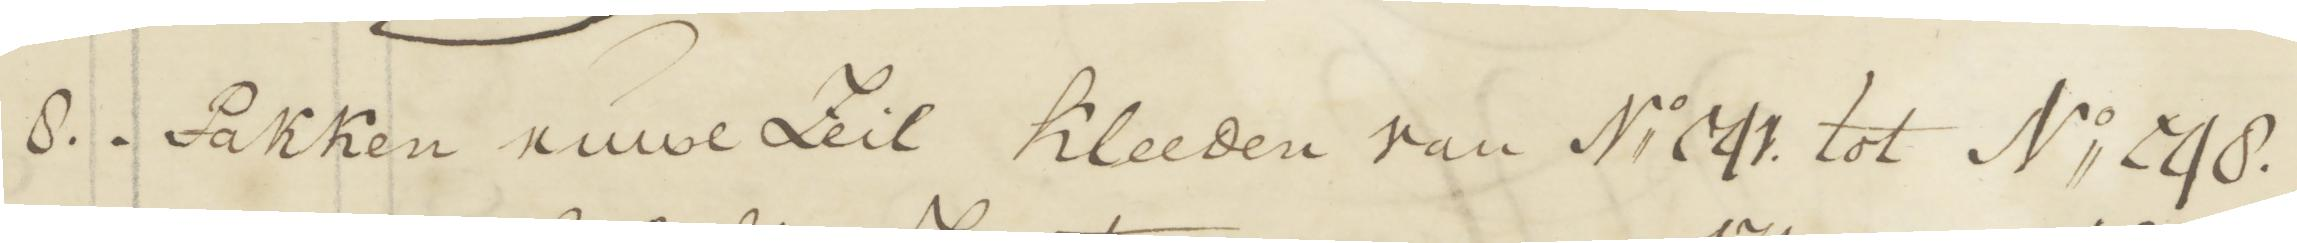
8. . Pakken ruwe Zeil kleeden van N„o 541. tot N„o 548.
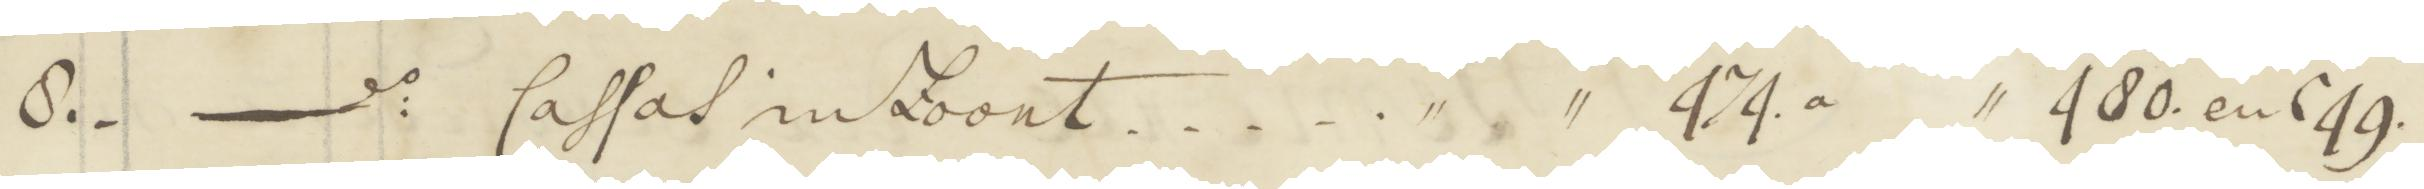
8. - _:o Cassas in Zoort . . . - . „ „ 474. a „ 480. en 549.
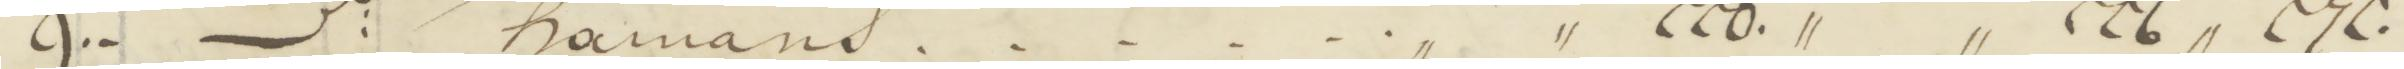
9. - _:o hamans . . - - - . „ „ 550. „ „ 556 „ 575.
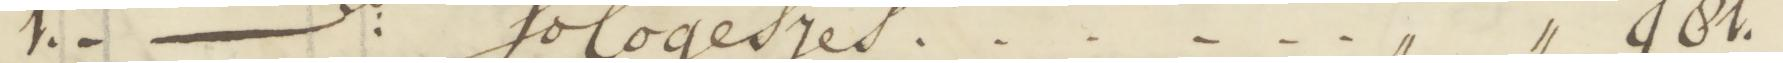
1. - _:o sologesjes . . . - - - „ „ 481.
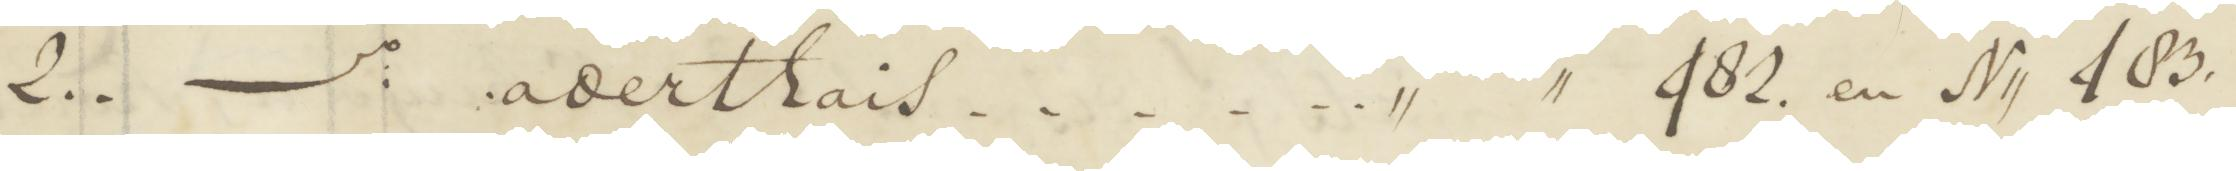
2. - _:o .aderthais - - - - - . „ „ 482. en N„ 483.
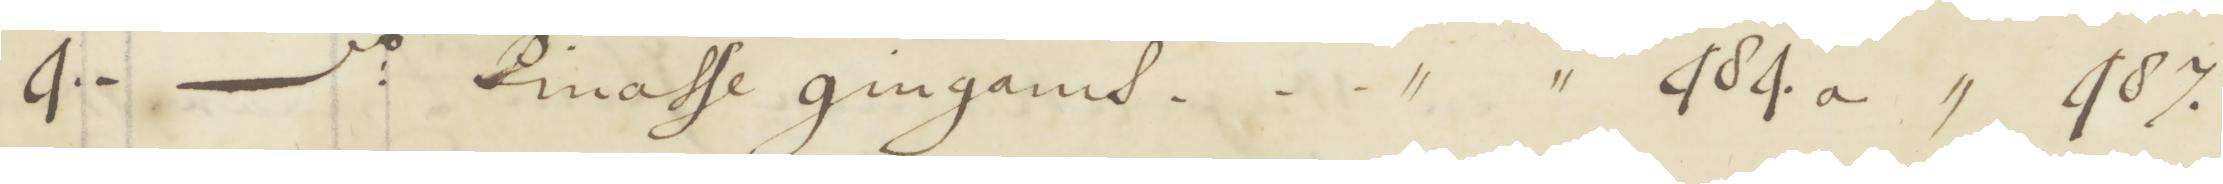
4. - _:o Pinasse gingams - - - „ „ 484.a „ 487.
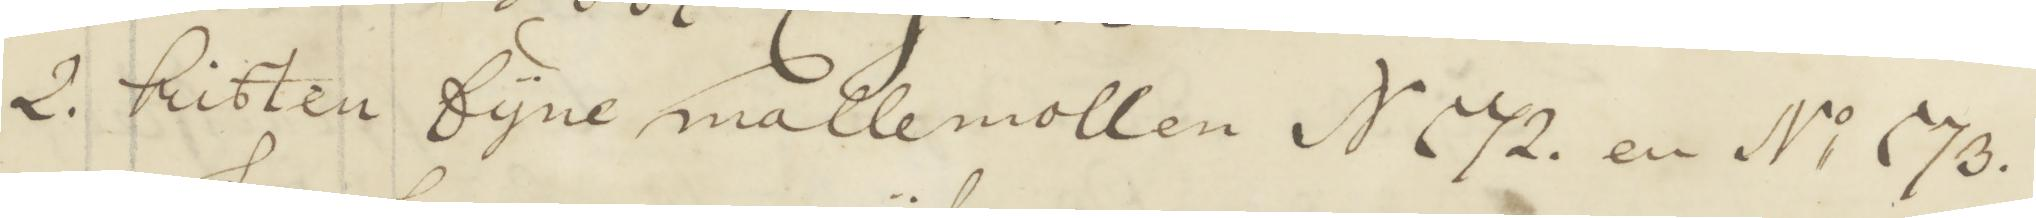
2. kisten fijne mallemollen N 572. en N„o 573.
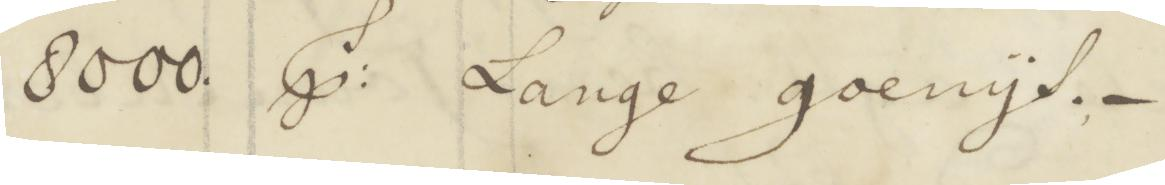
8000. p:s Lange goenijs. -
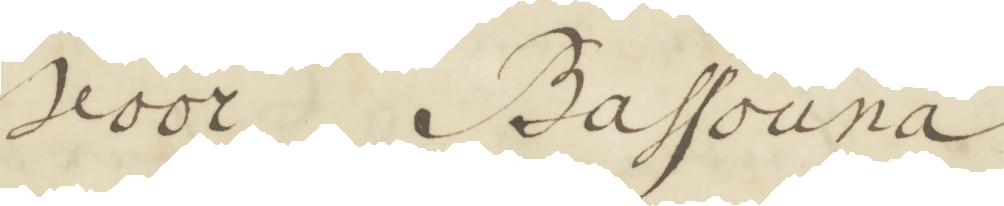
voor Bassouna
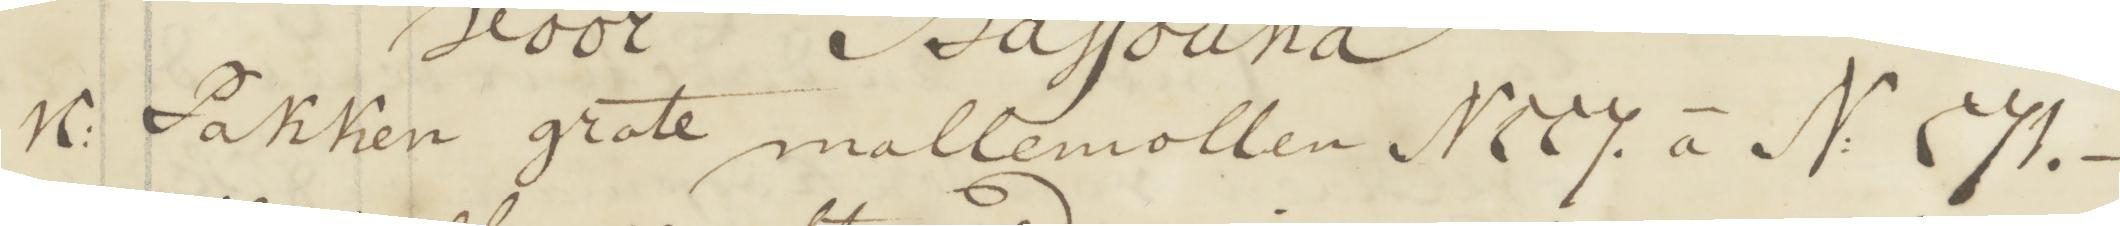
15: Pakken grote mallemollen N557. â N: 571.-
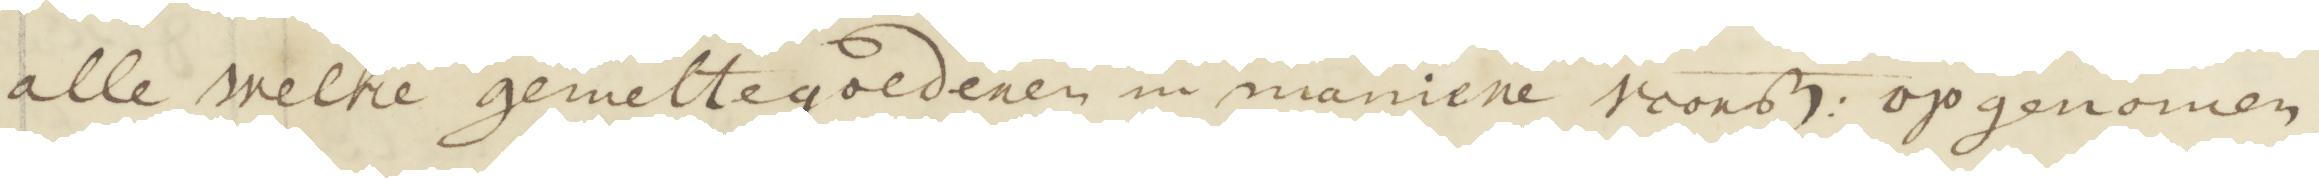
alle welke gemelte goederen in maniere voorsz: opgenomen
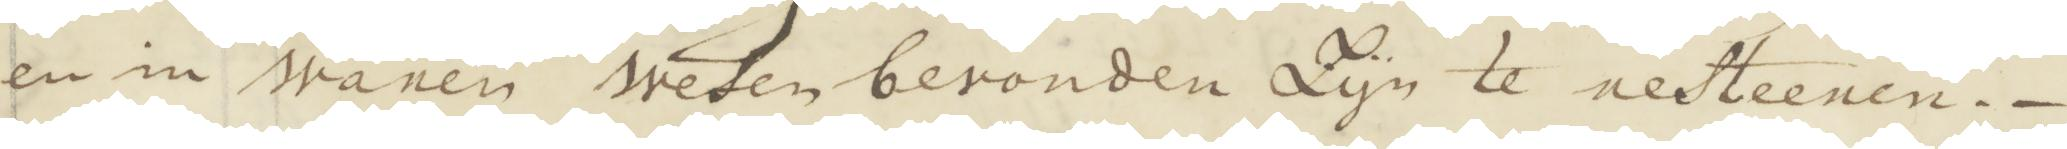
en in waren wesen bevonden zijn te resteeren.-
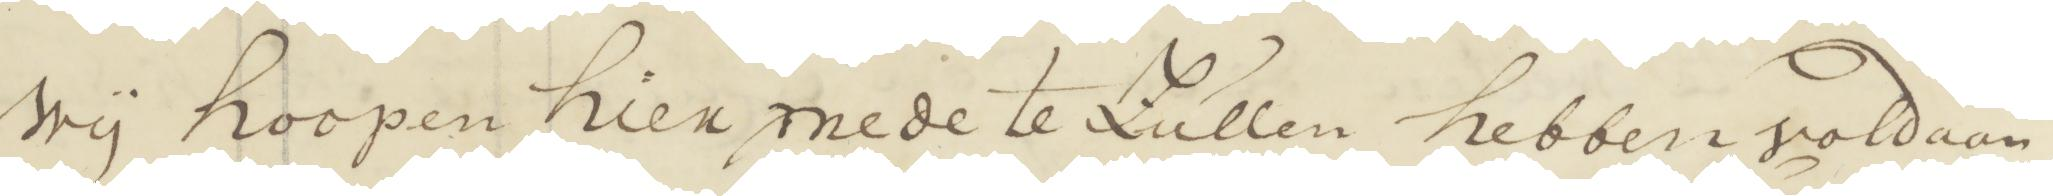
wij hoopen hier mede te zullen hebben voldaan
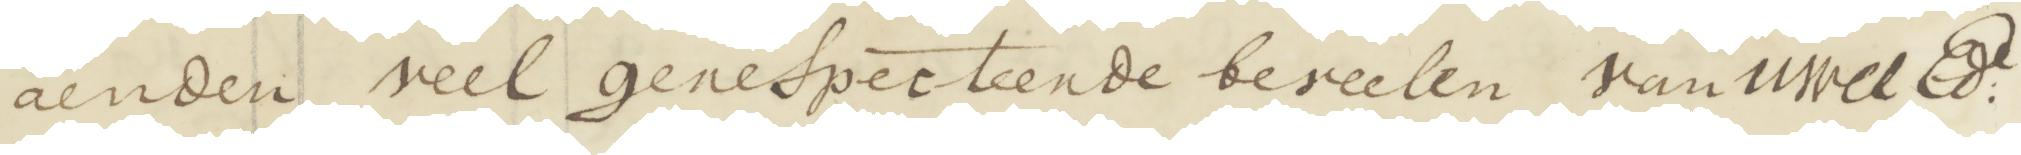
aenden veel gerespecteerde beveelen van uwel Ed:l
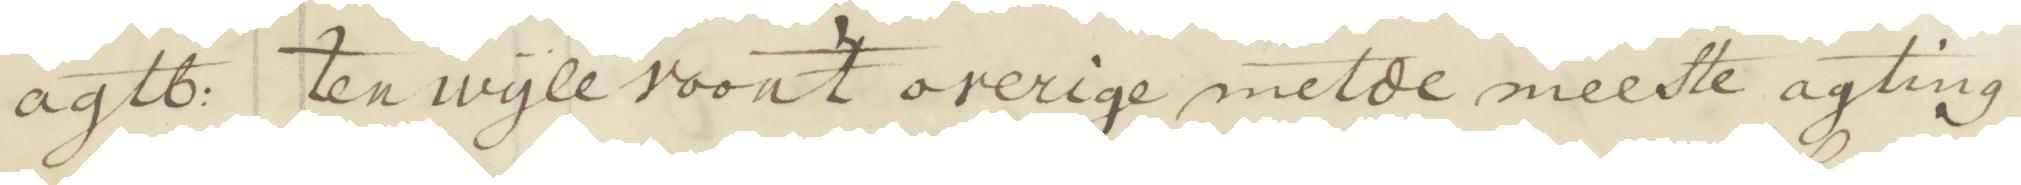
agtb: ter wijle voor ’t overige metde meeste agting
